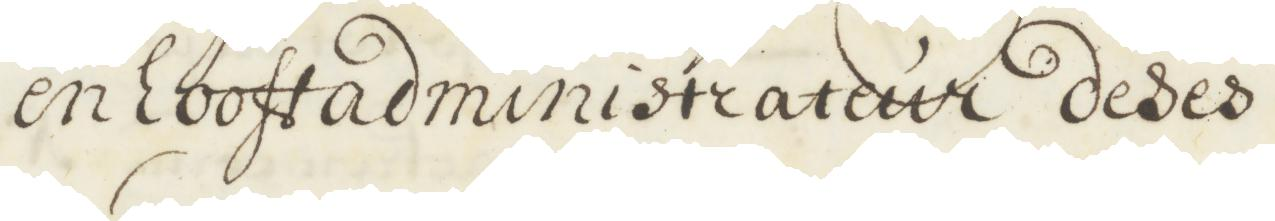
en hooftadministrateur deses
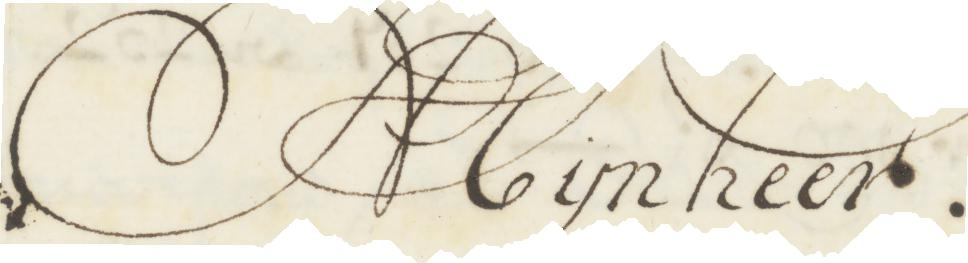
Mijnheer.
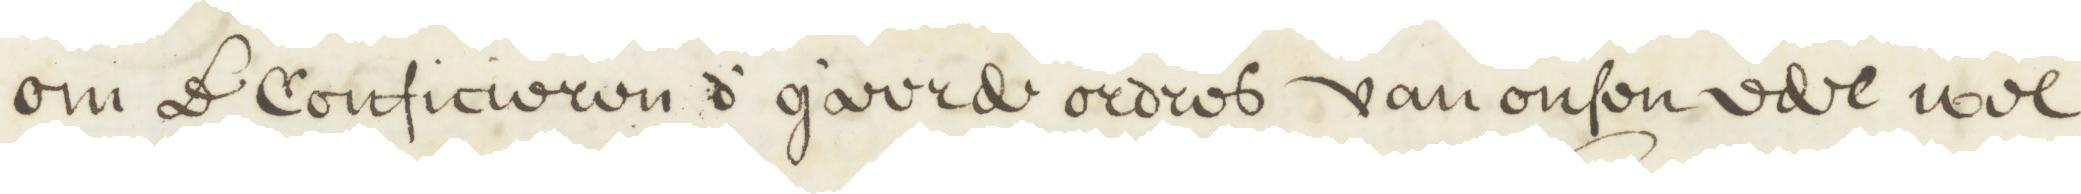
om te conficieren d’ g'eerde ordres van onsen edel wel
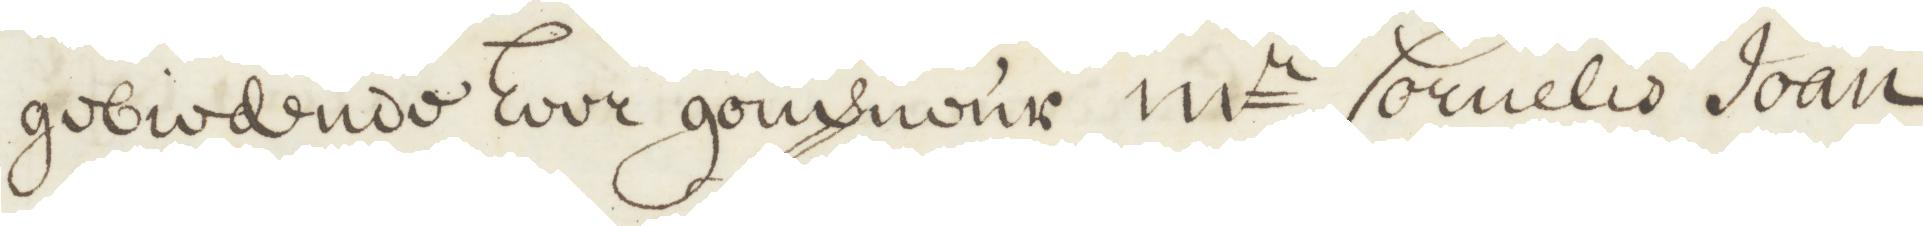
gebiedende heer gouverneur m=r Cornelis Ioan
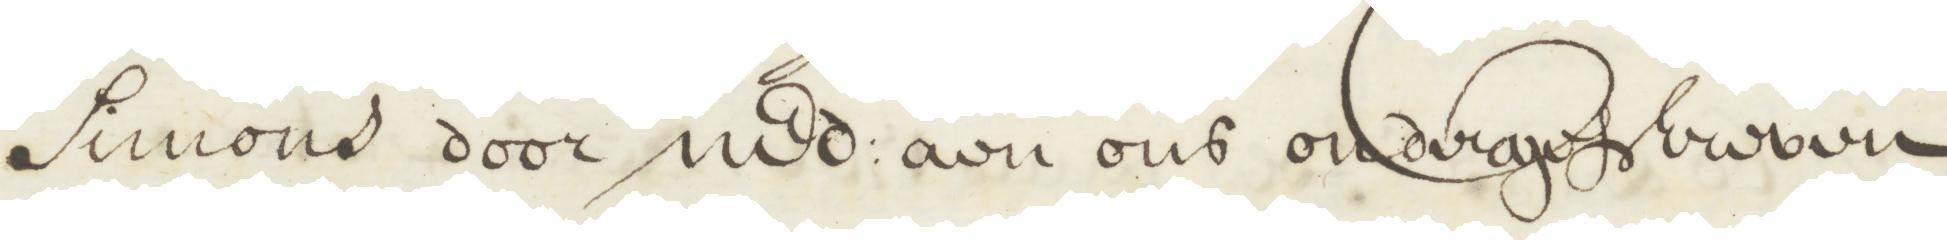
Simons door uEd: aen ons ondergeschreven
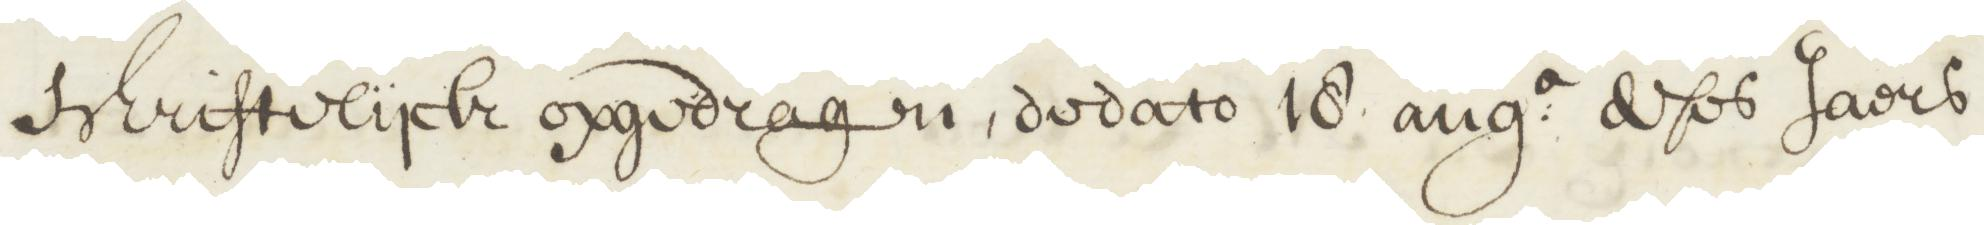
schriftelijck opgedragen, de dato 18: aug:o deses Jaers
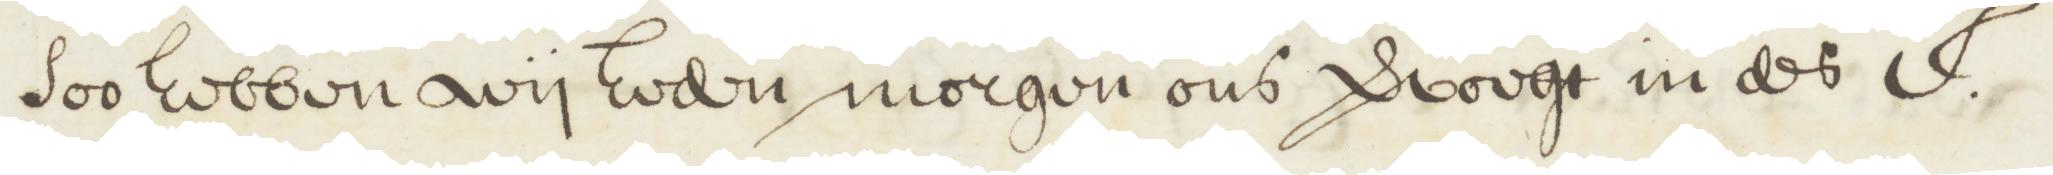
soo hebben wij heden morgen ons vervoegt in des E.
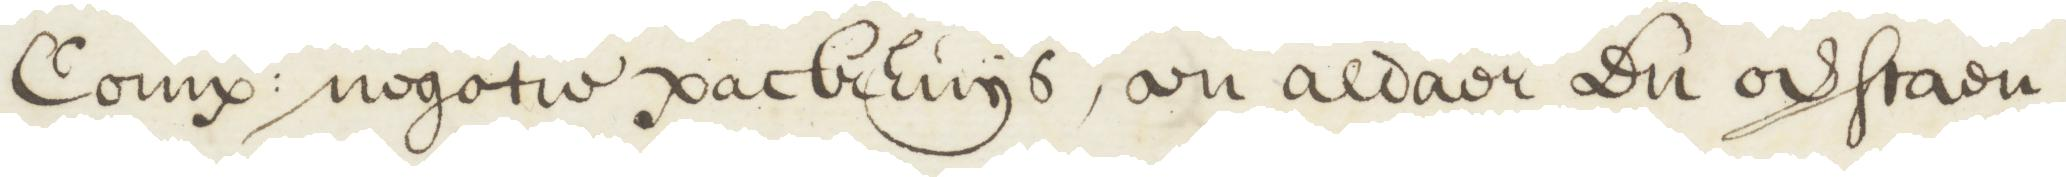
Comp:s negotie packhuijs, en aldaer ten overstaen
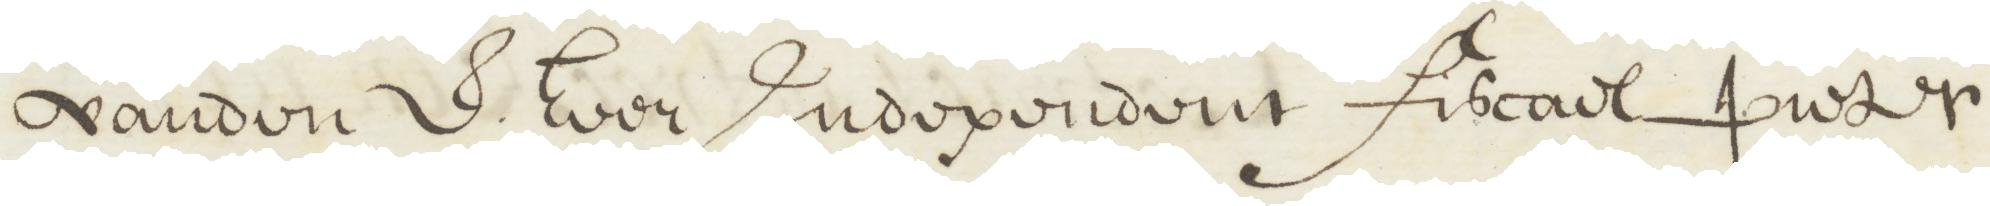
van den E. heer Jndependent fiscael pieter
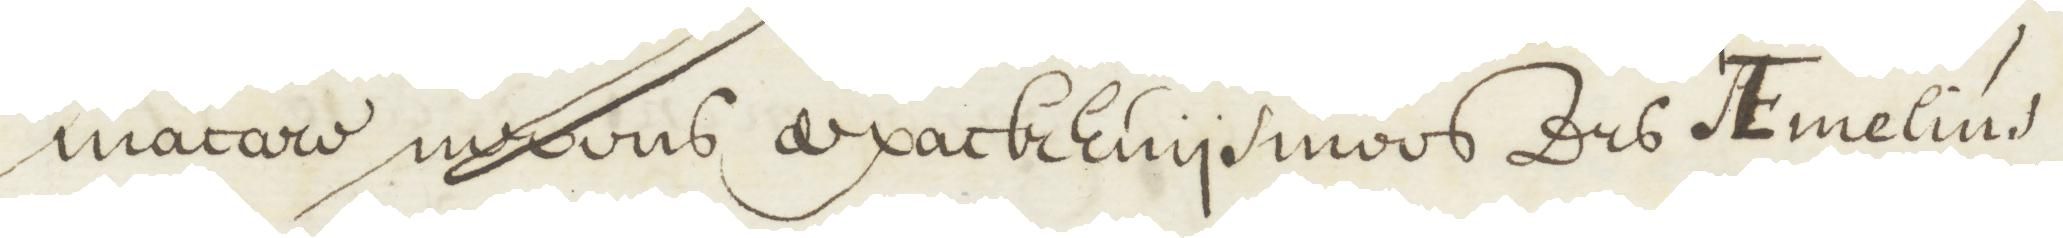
macare nevens de packhuijsmeesters AEmelius
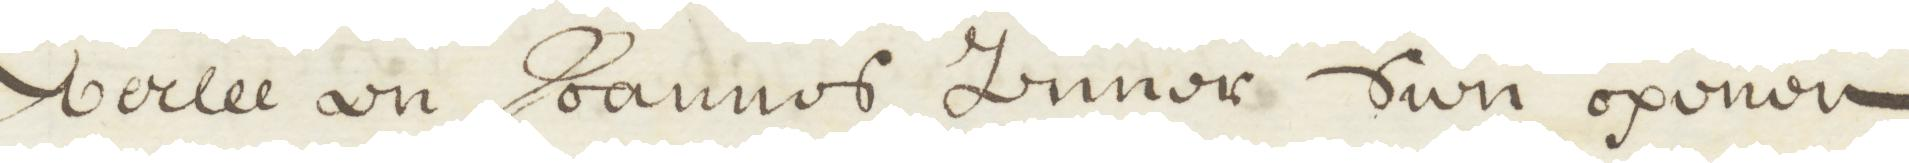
verlee en Joannes Zenner sien openen
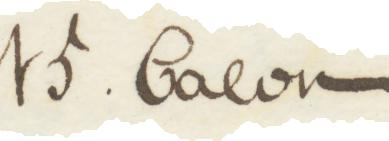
15. balen
